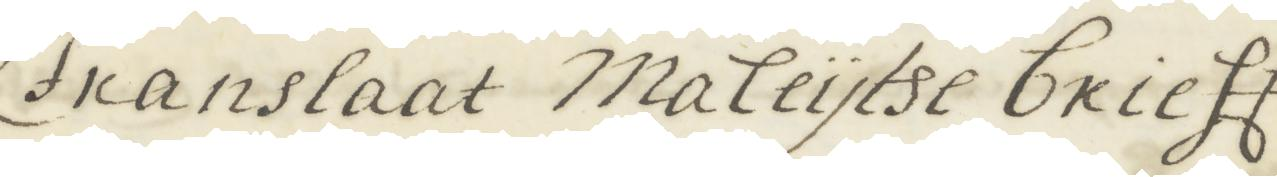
Translaat Maleijtse brieff
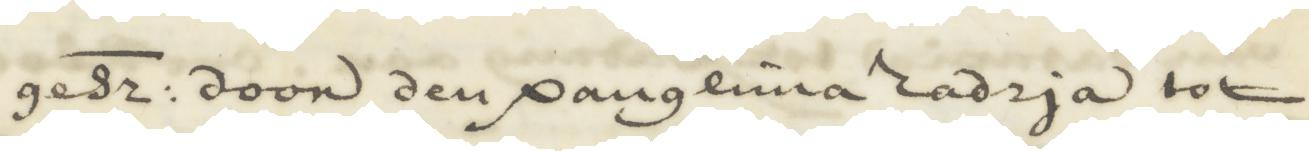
gesz: door den panglima radzja tot
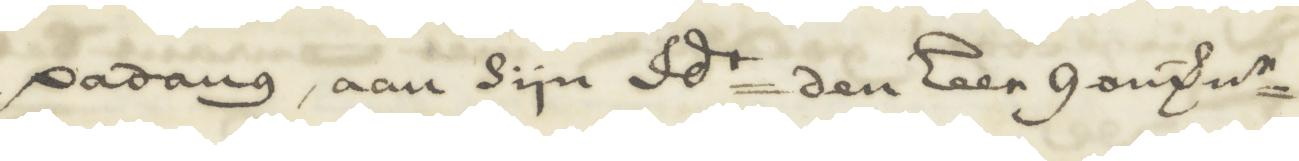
padang, aan sijn Ed=t den heer gouvern=r
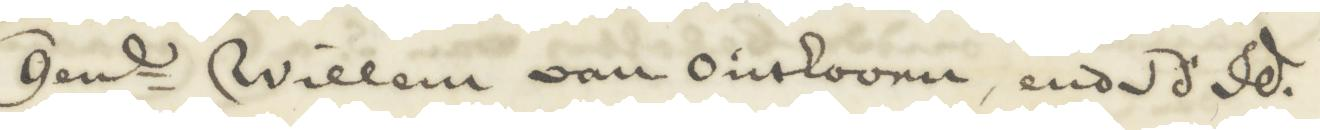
gen=l Willem van outhoorn, ende d’ Ed.
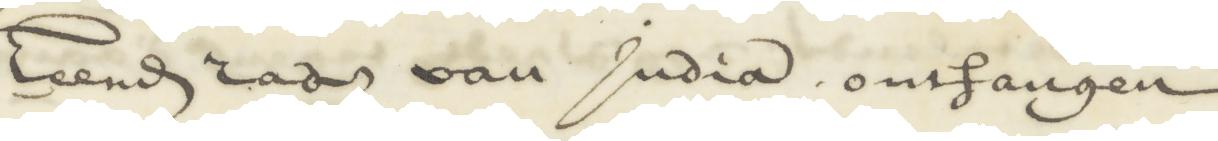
heeren raden van jndia, ontfangen
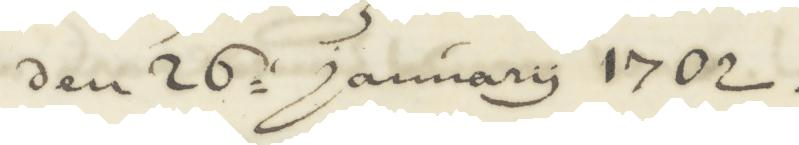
den 26:e januarij 1702.
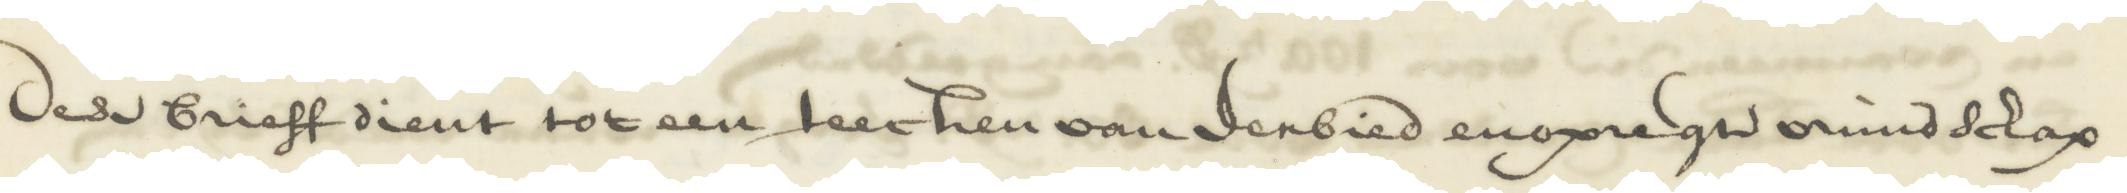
dese brieff dient tot een teecken van Eerbied en opregte vundschap
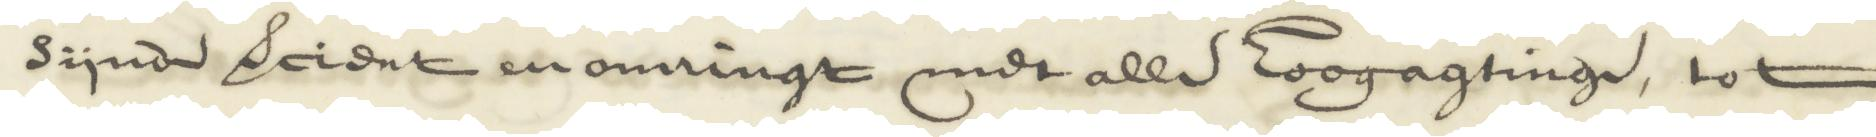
sijnde verciert en omringt met alle hoogagtinge, tot
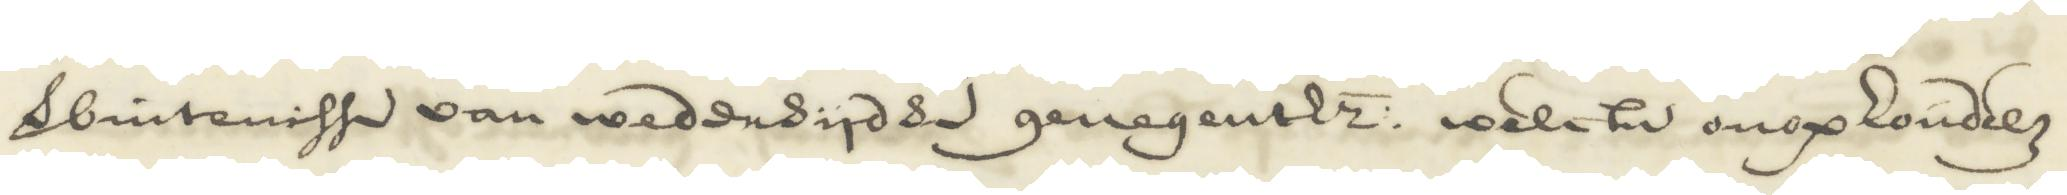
verbintenisse van wedersijdse genegenthz: welcke onophoudelijk
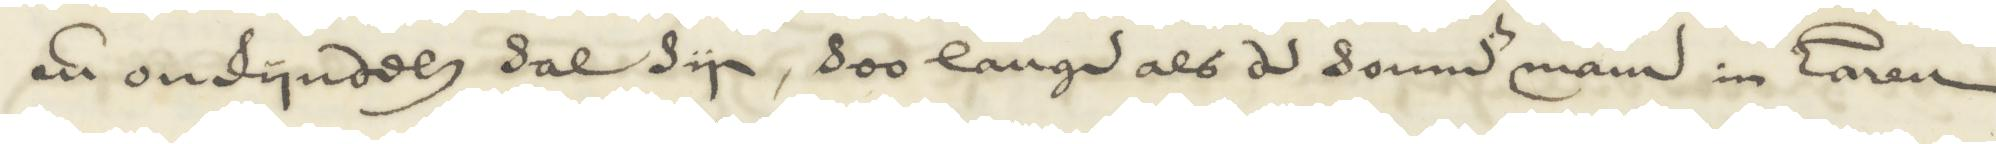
en oneijndelijk sal sijn, soo lange als de sonne en mane in haren
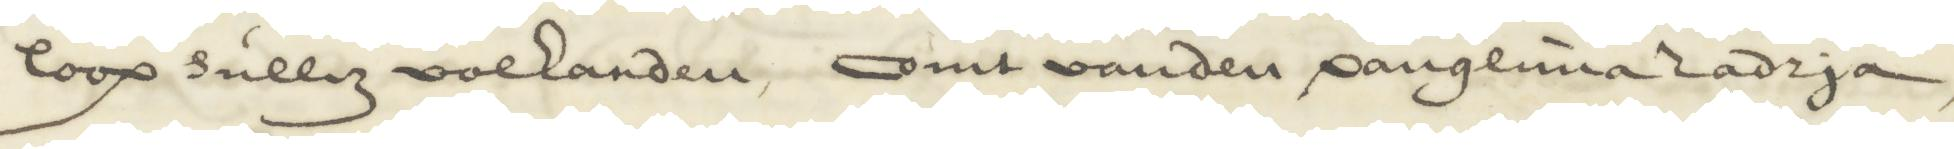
loop sullen volharden, comt vanden panglima radzja
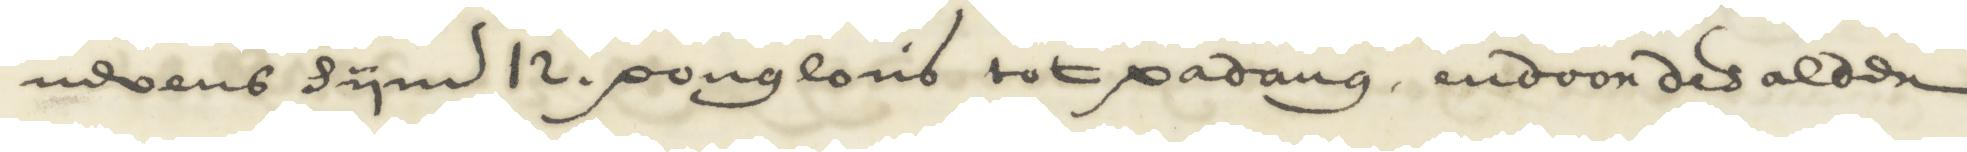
nevens sijne 12. ponglous tot padang, en door des alder
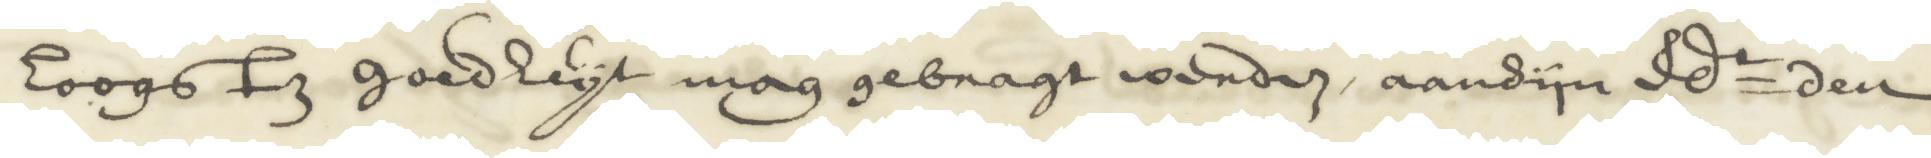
hoogsten goedheijt mag gebragt werden, aansijn Ed=e den
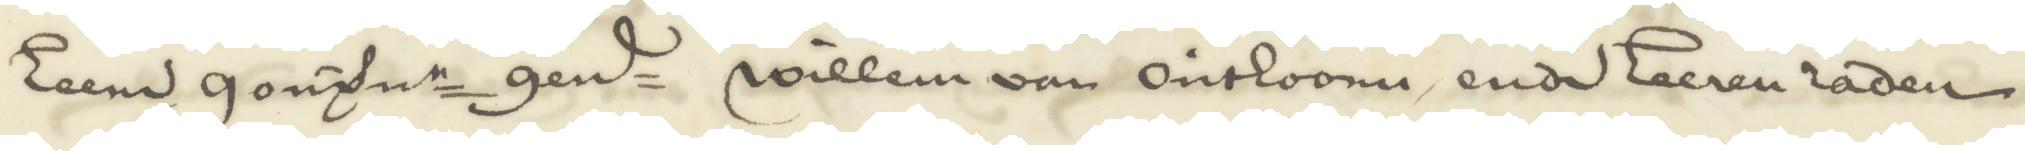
heere gouvern=r gen=l willem van outhoorn, ende heeren raden
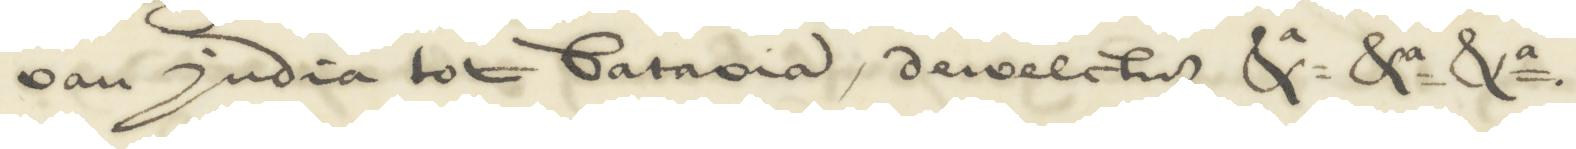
van jndia tot batavia, dewelckelijk &=a &=a &=a.
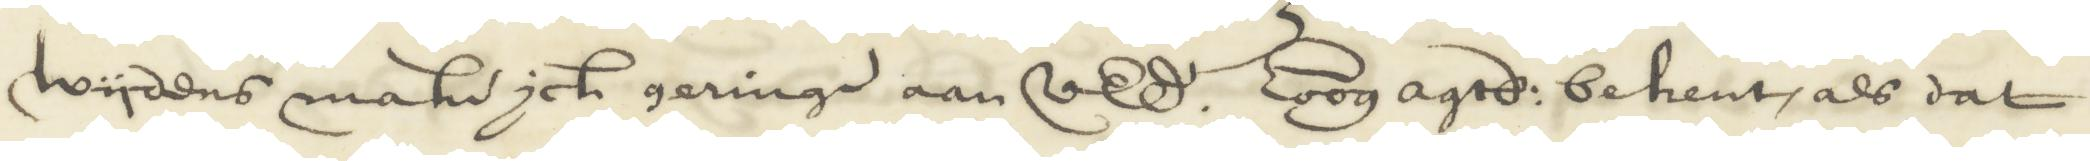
wijders make jck geringe aan VEd: hoog agtb: bekent, als dat
